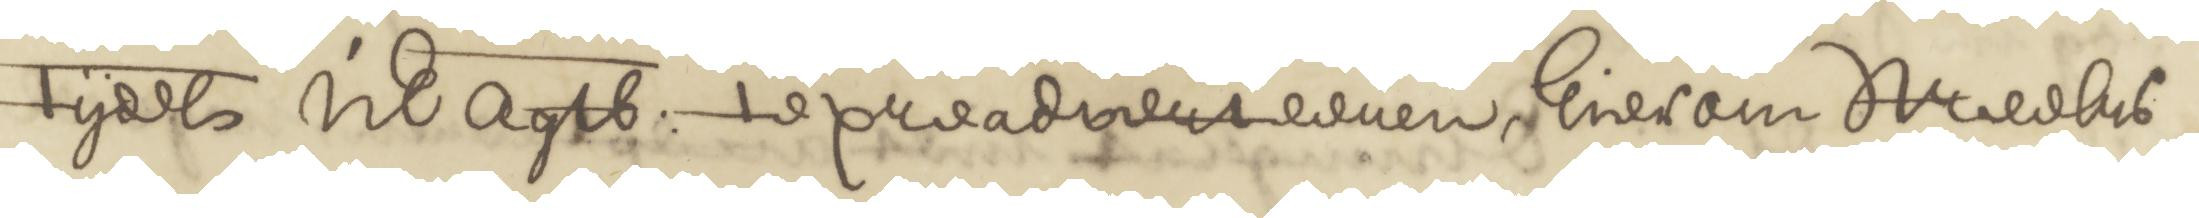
tijdelijk UE Agtb: te preadverteeren, hier om streeks
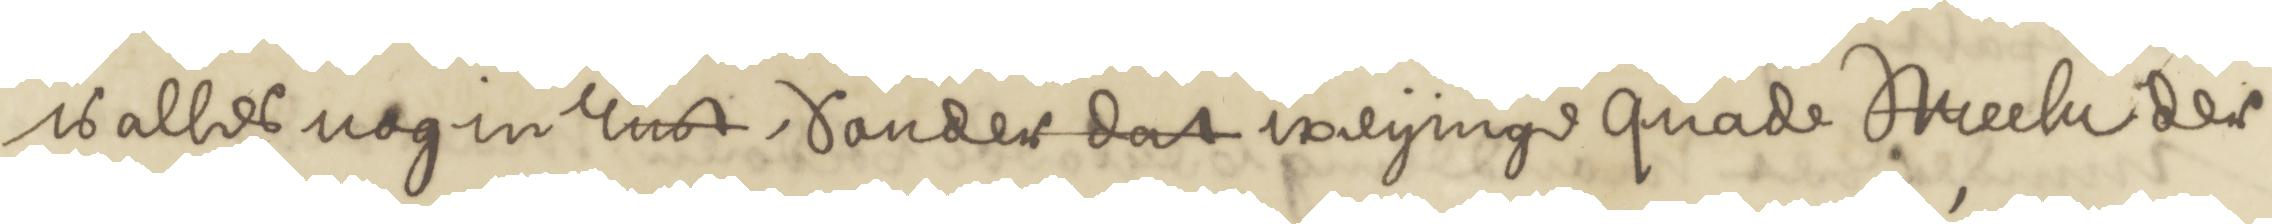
is alles nog in rust, sonder dat weijnige quade streek der
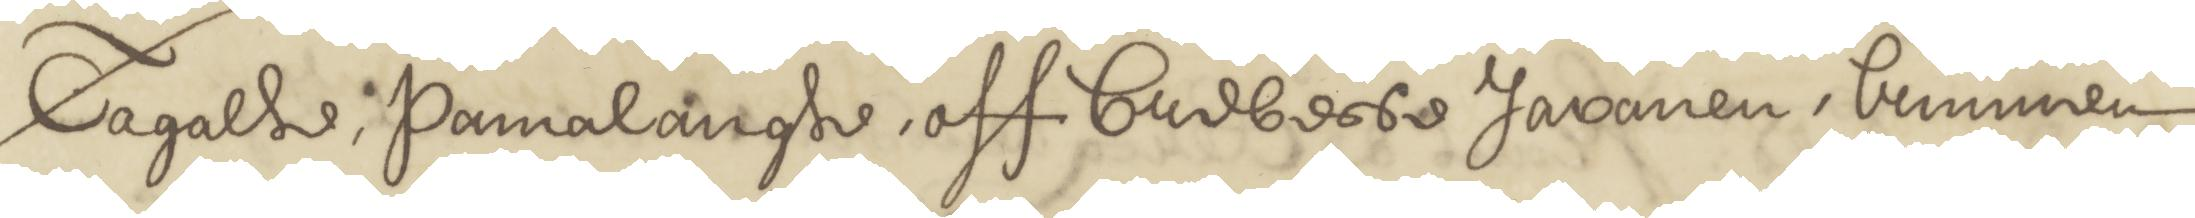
Tagalse, Pamalangse, off Brebesse Javanen, kunnen
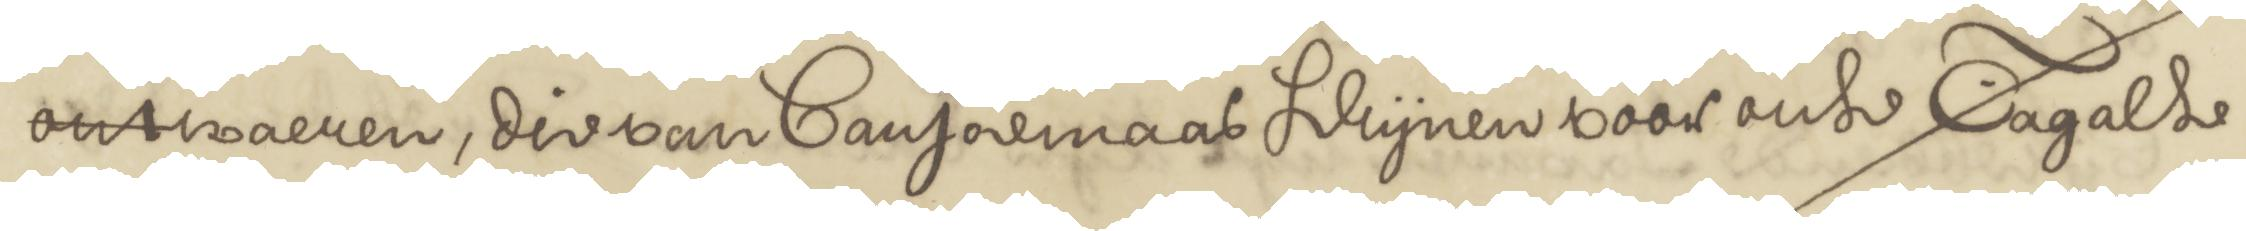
ontwaeren, die van Banjoemaas schijnen voor onse Tagalse
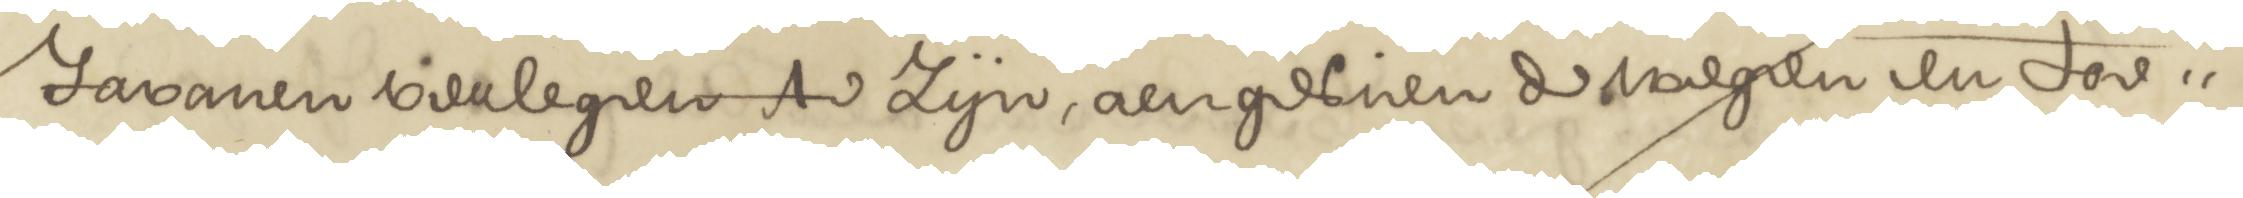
Javanen verlegen te zijn, aen gesien de wegen en toe„
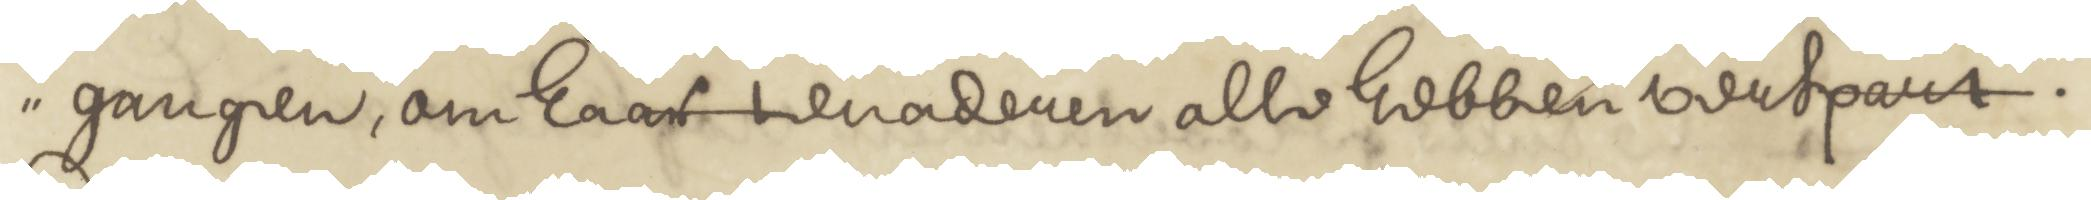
„ gangen, om haar tenaderen alle hebben verspart.
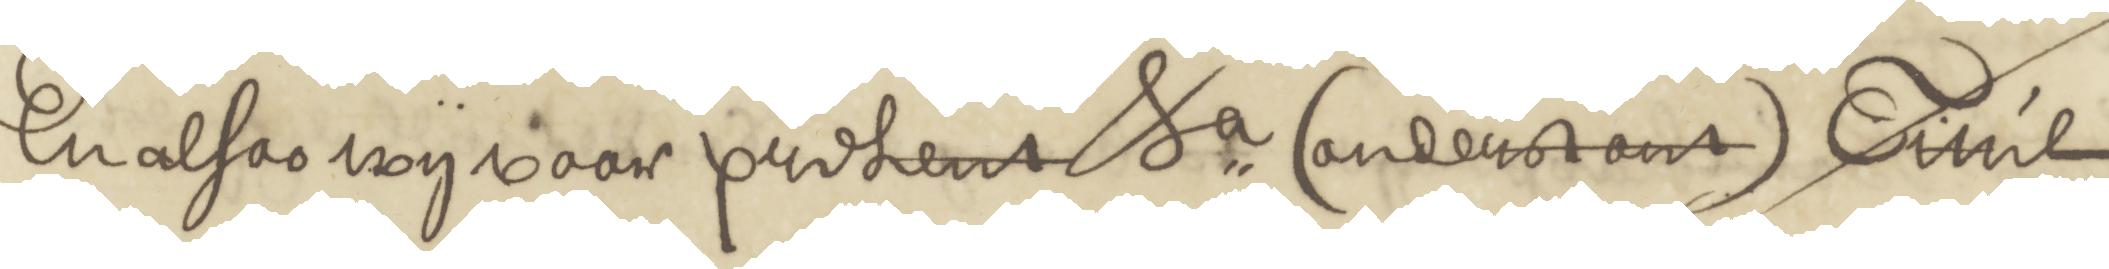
En alsoo wij voor present &„a (onderstont) Titul
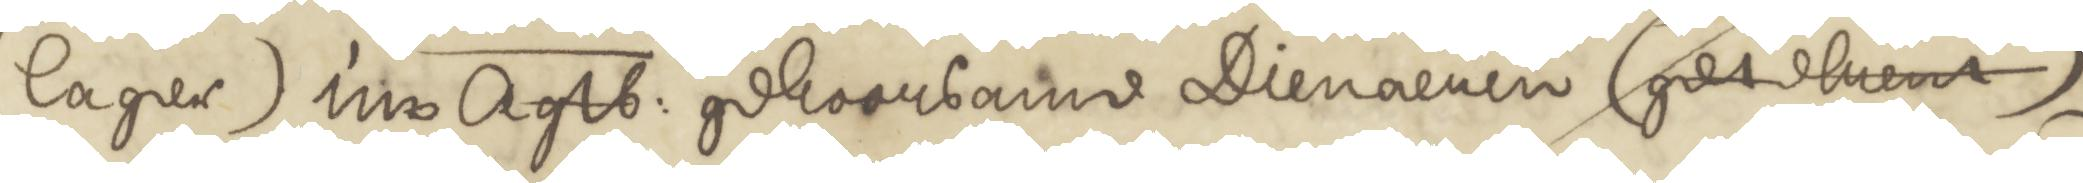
(lager) uw Agtb: gehoorsame Dienaeren (getekent)
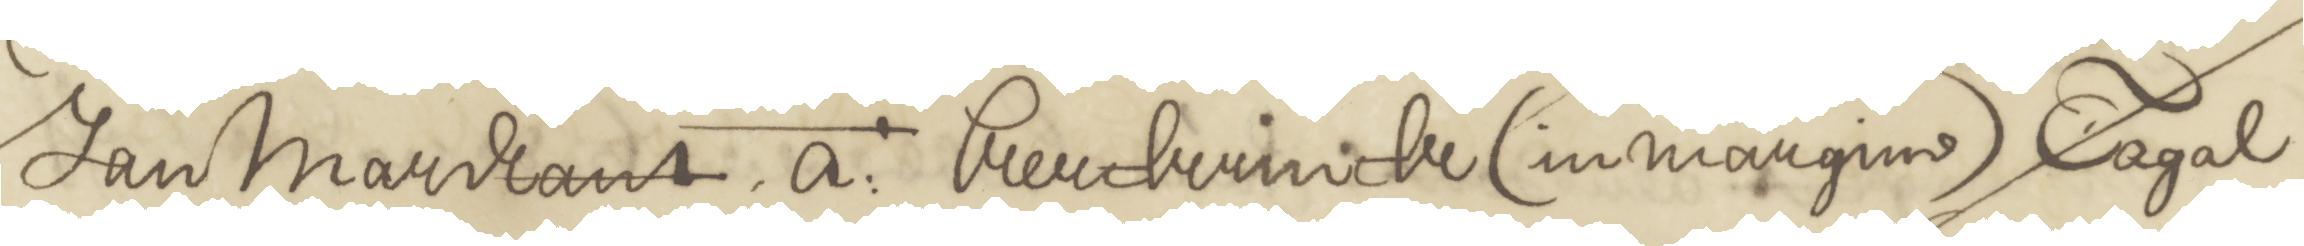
Jan Marchant, A:t kerckrinck (in margine) Tagal
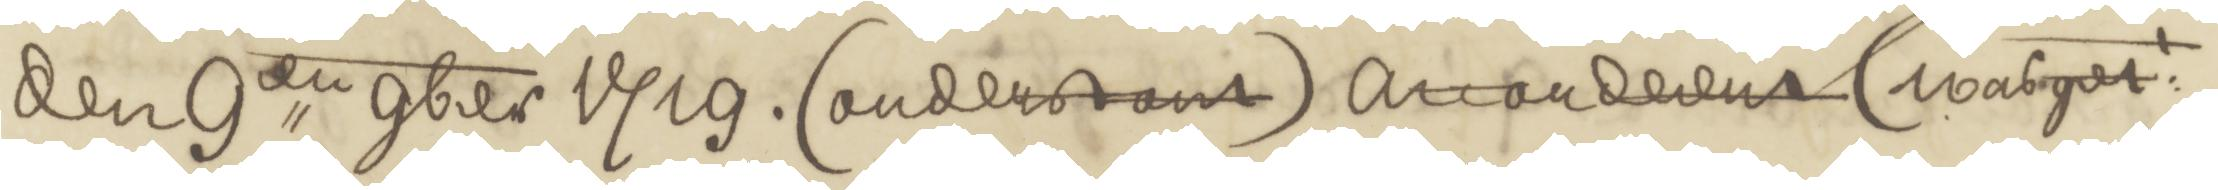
den 9„en 9ber 1719. (onderstont) accordeent (was get:t
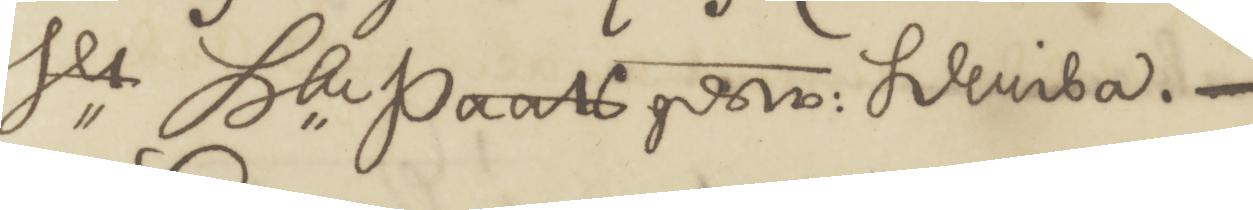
V„t H„k Paats gesw: schriba. —
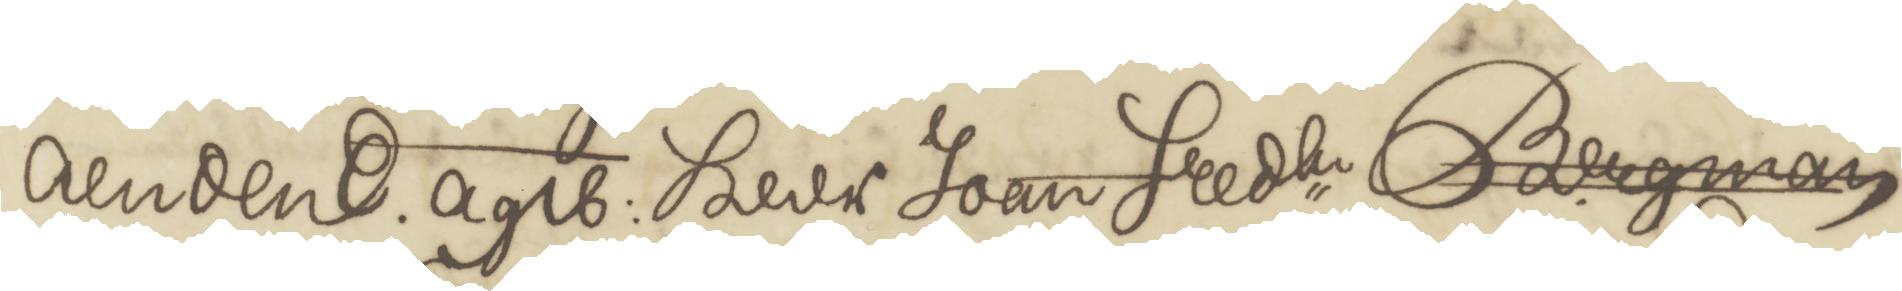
aen den E. agtb: Heer Joan Fred„k Bergman
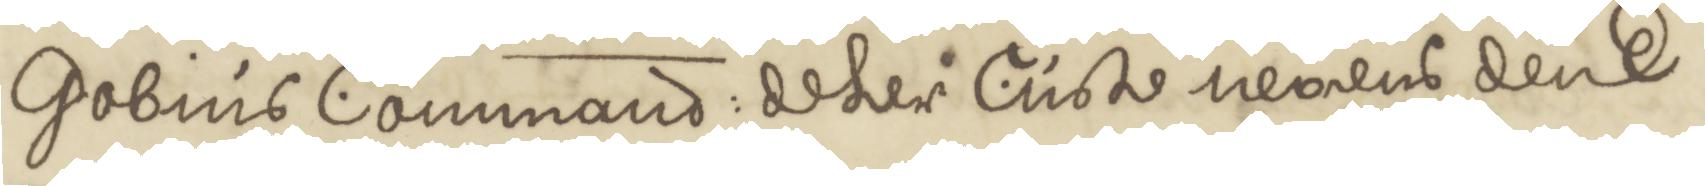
Gobius Command: deser Custe nevens den E
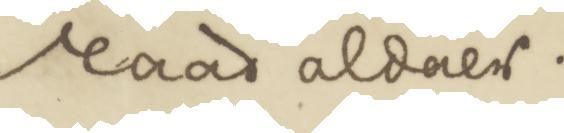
raad aldaer.
